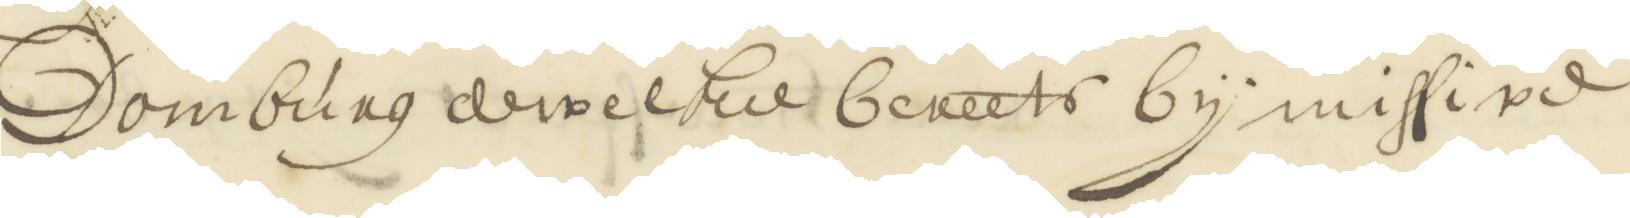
Domburg dewelke bereets bij missive
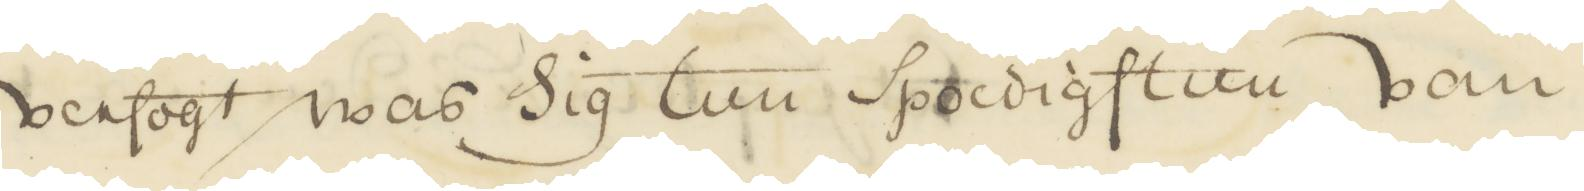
versogt was sig ten spoedigsten van
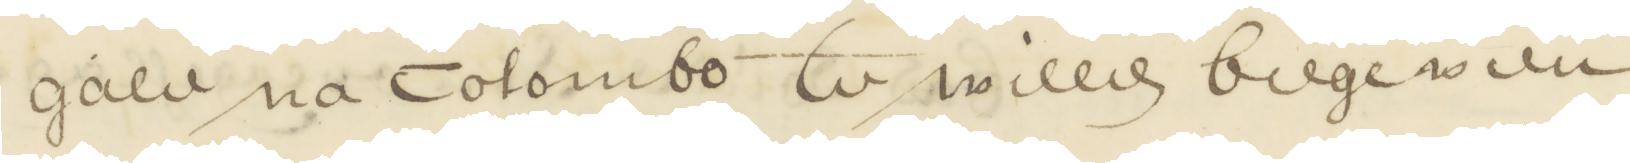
gale na colombo te willen begeven
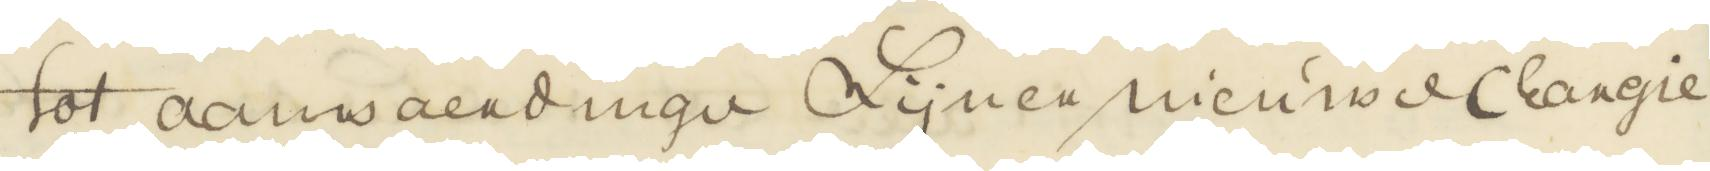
tot aanvaerdinge Zijner nieuwe chargie
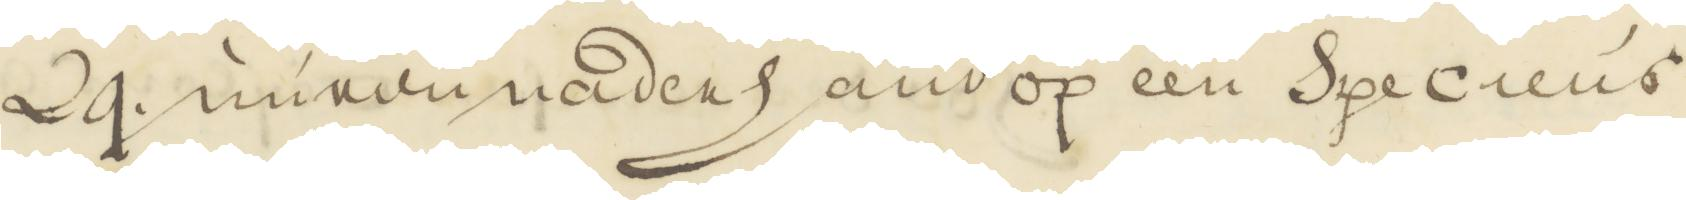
24. uuren naderhand op een specieus
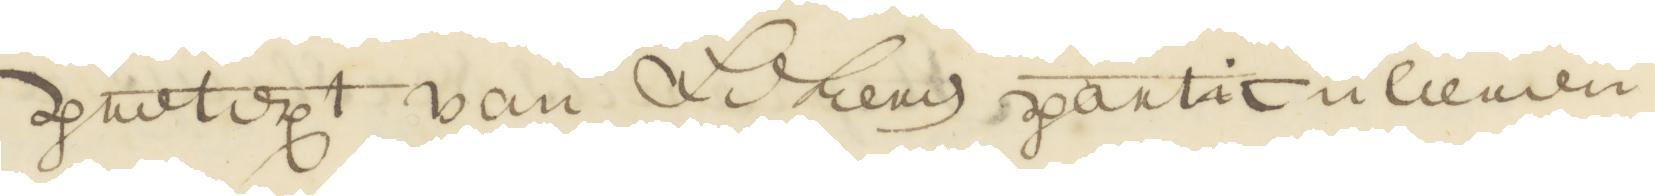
pretext van Sekeren particulieren
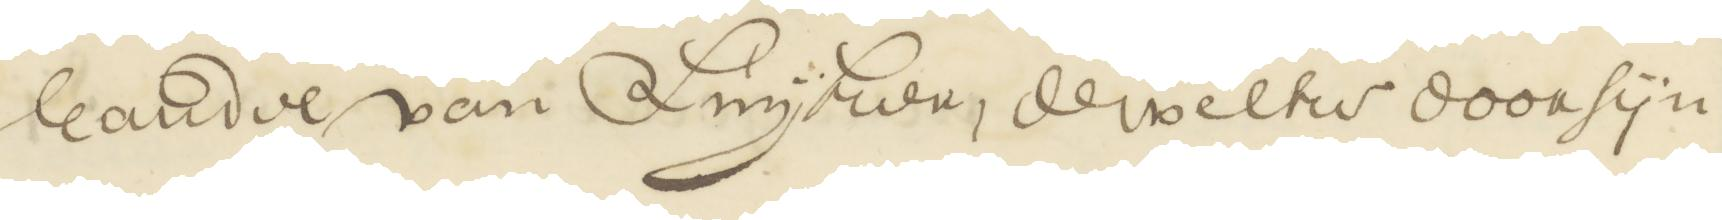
handel van Suijker, dewelke door sijn
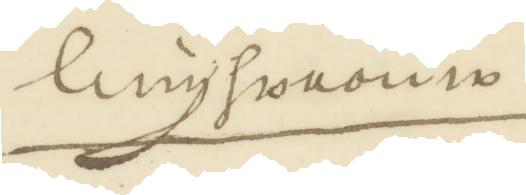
huijsvrouw
